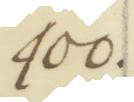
400.
